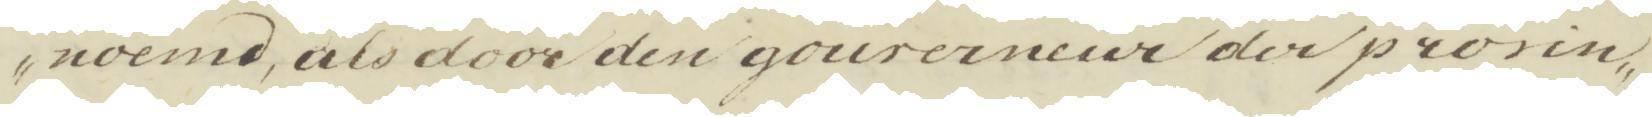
„noemd, als door den gouverneur der provin„
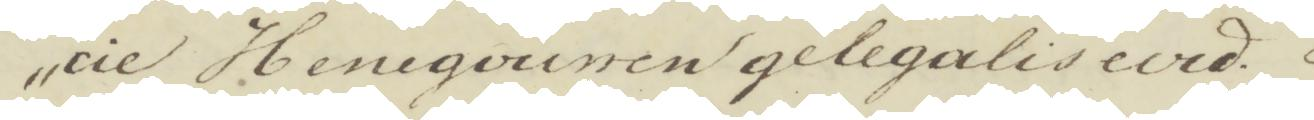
„cie Henegouwen gelegaliseerd.
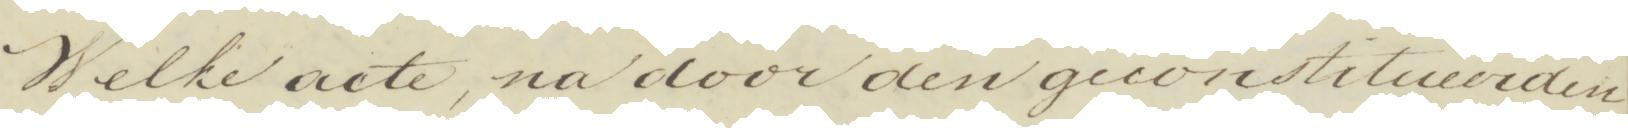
Welke acte, na door den geconstitueerden
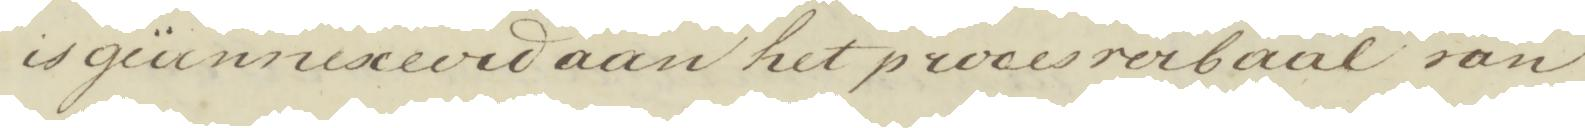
is geännexeerd aan het proces verbaal van
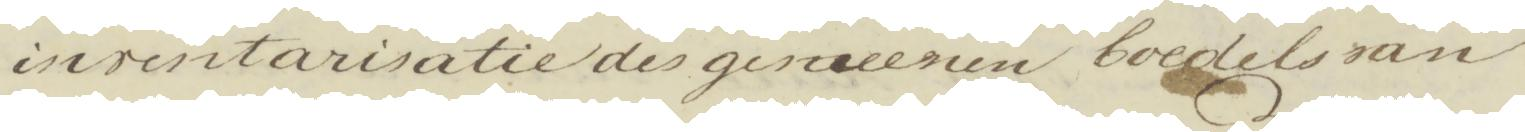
inventarisatie des gemeenen boedels van
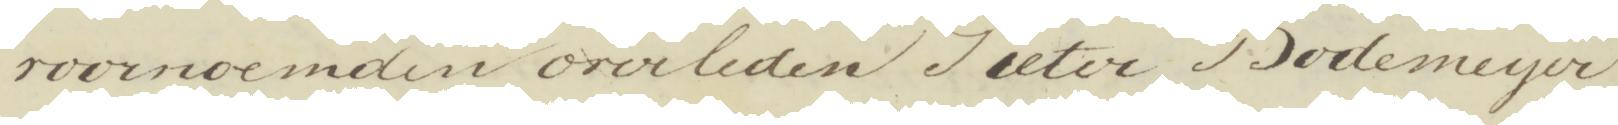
voornoemden overleden Pieter Bodemeyer
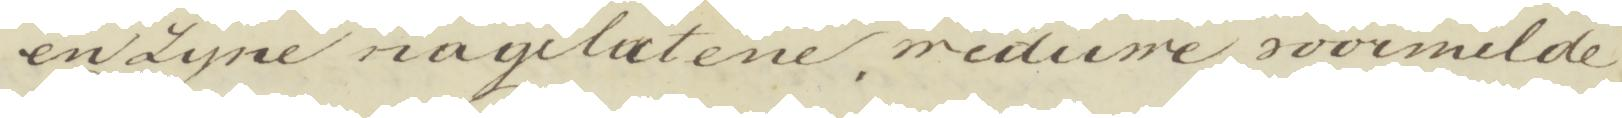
en zyne nagelatene, weduwe voormelde
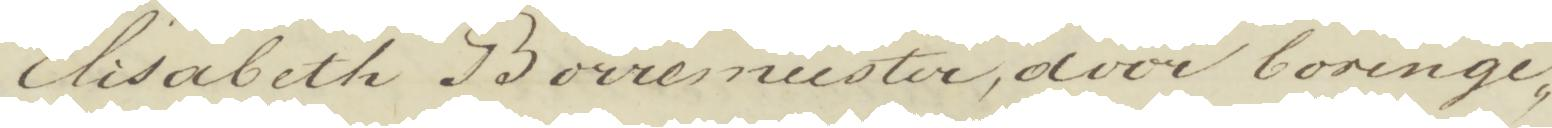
Elisabeth Borremeester, door bovenge„
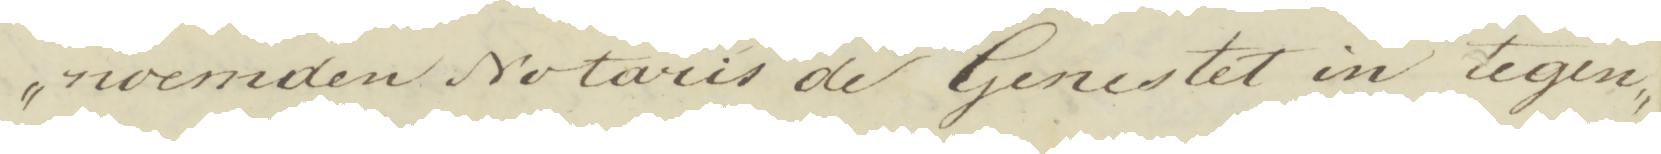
„noemden Notaris de Genestet in tegen„
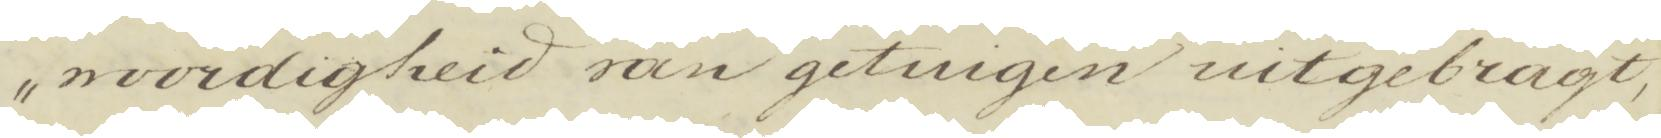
„woordigheid van getuigen uitgebragt,
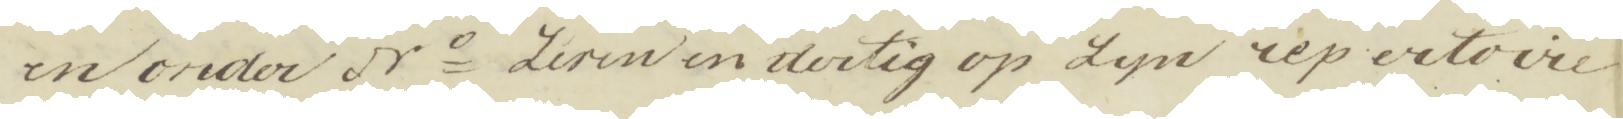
en onder N=o zeven en dertig op zyn repertoire
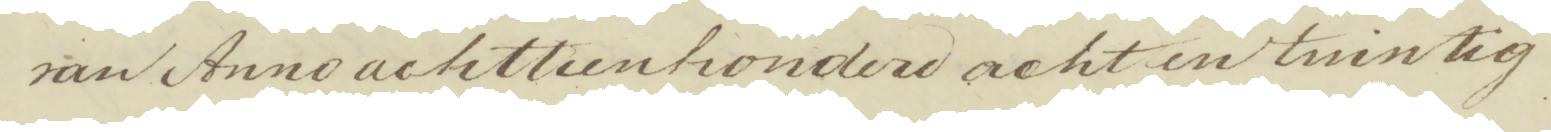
van Anno achttienhonderd acht en twintig
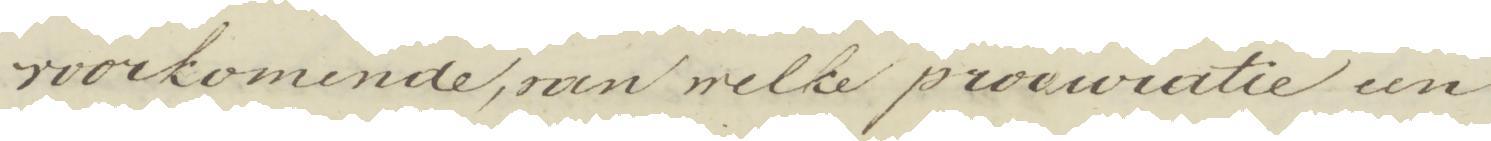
voorkomende, van welke procuratie een
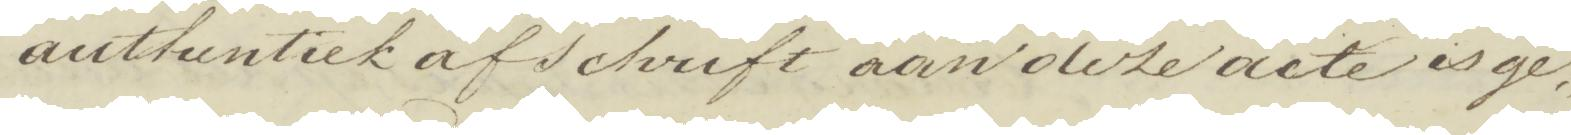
authentiek afschrift aan deze acte is ge
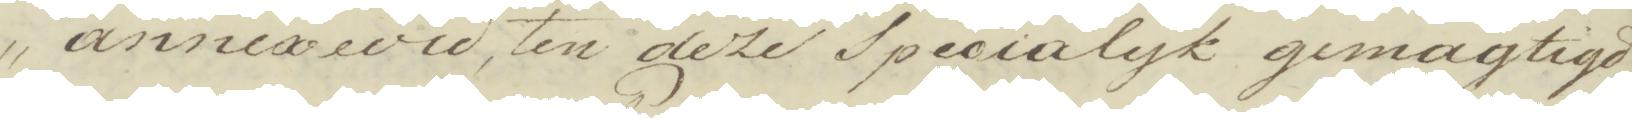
„annexeerd, ten deze specialyk gemagtigd
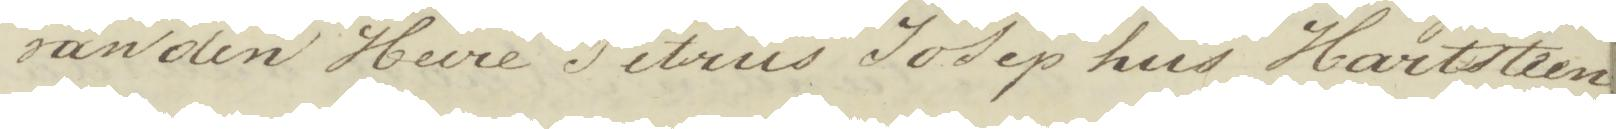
van den Heere Petrus Iosephus Hartsteen
